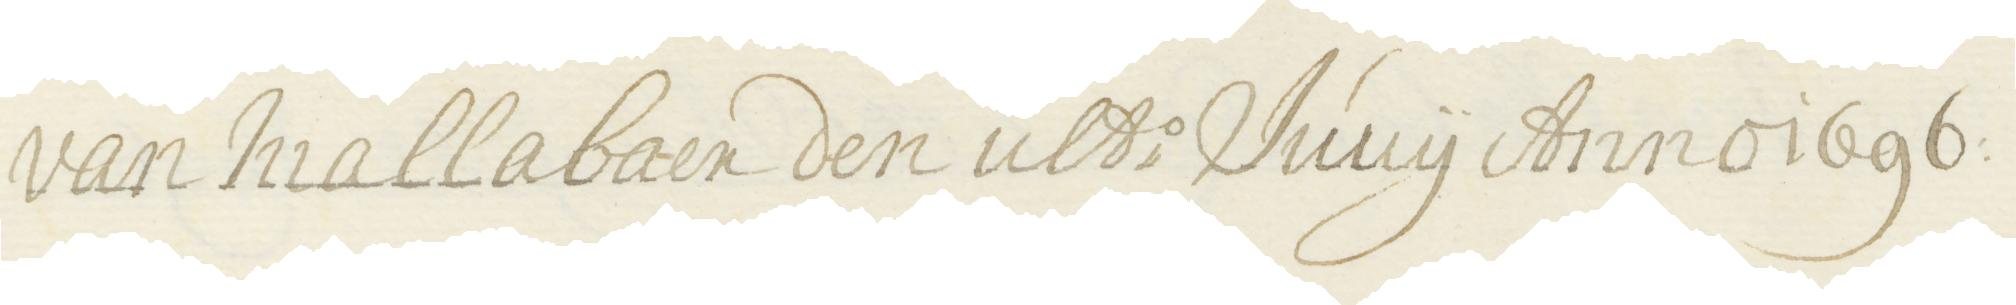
van Mallabaer den ult=o Iunij Anno 1696:
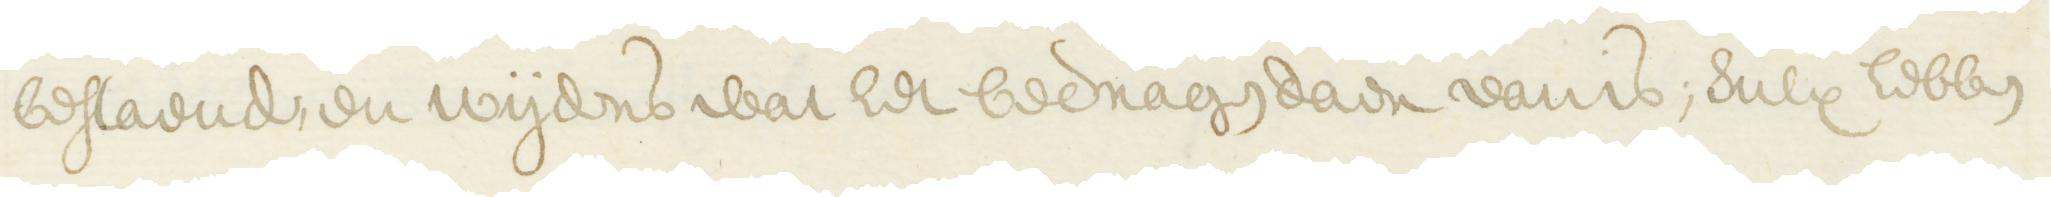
bestaende, en wijders wat het bedragen daer van is; sulx hebben
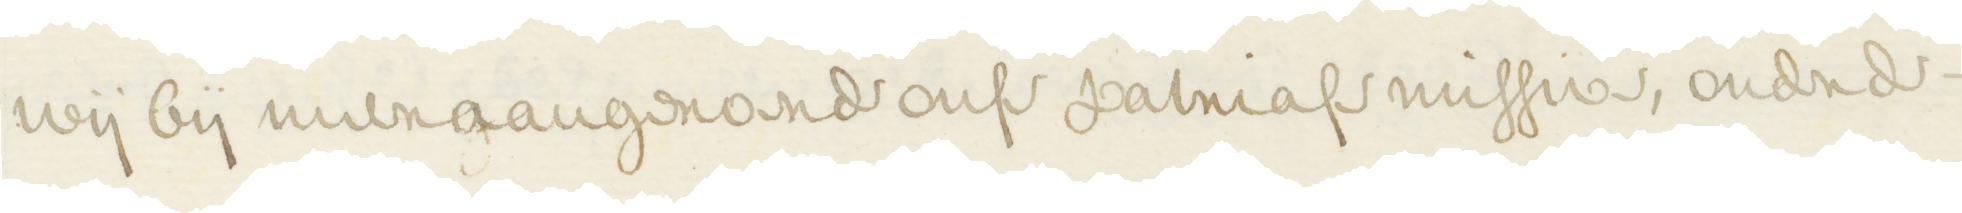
wij bij mer aangeroerde onse patriase missive, onder de
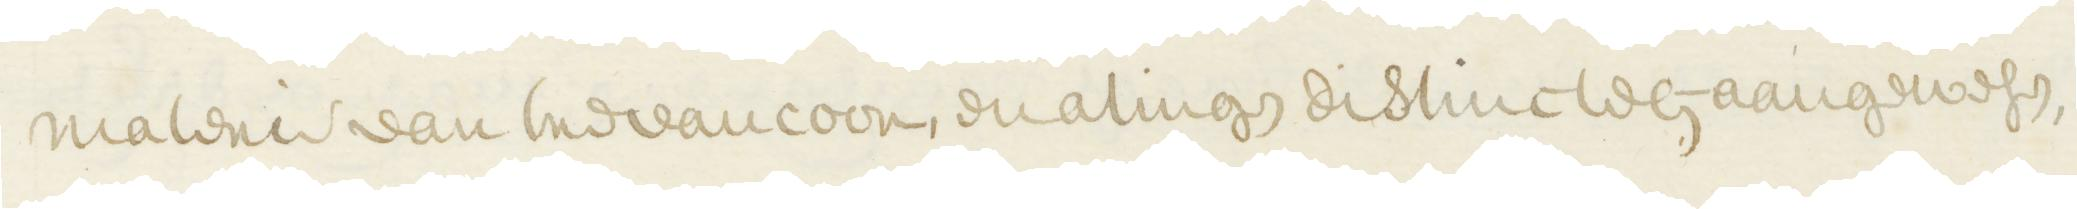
materie van trevancoor, en atingen distinctelijk aangewesen,
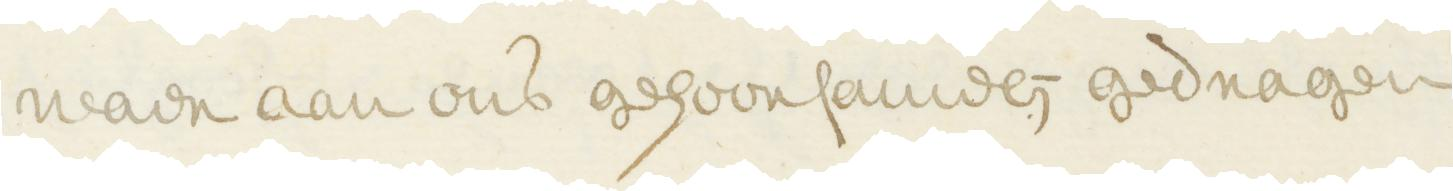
waer aan ons gehoorsamelijk gedragen
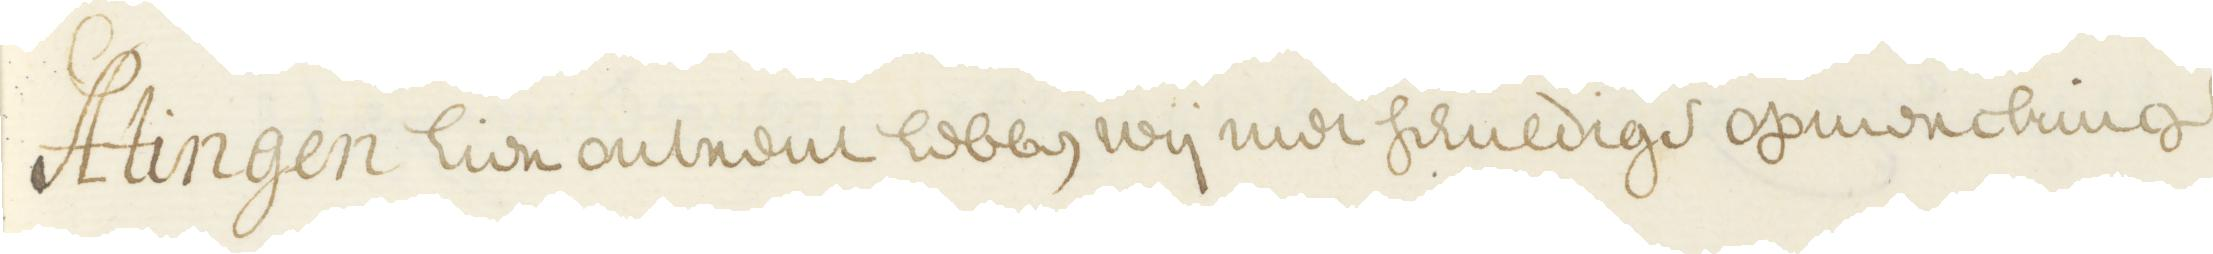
Atingen hier ontrent hebben wij met schuldige opmerckinge
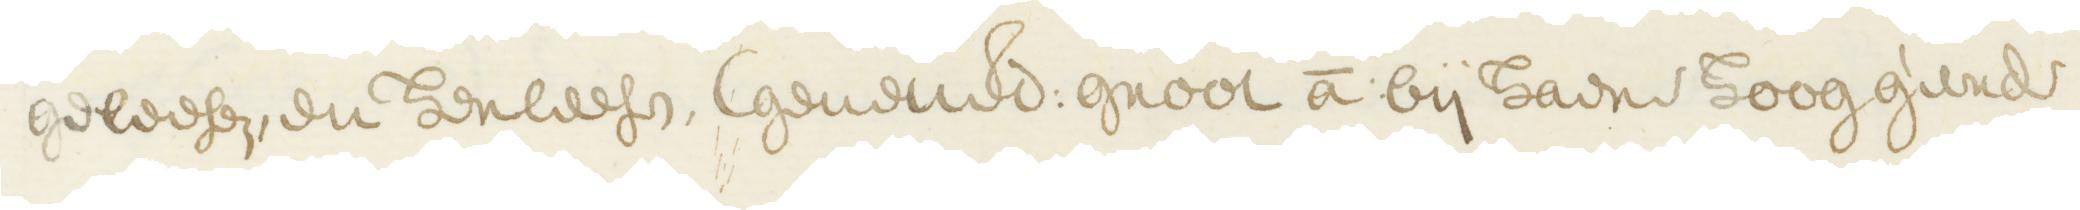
geleesen, en herleesen, 'tgene uEd: groot a: bij haere hoog g'eerde
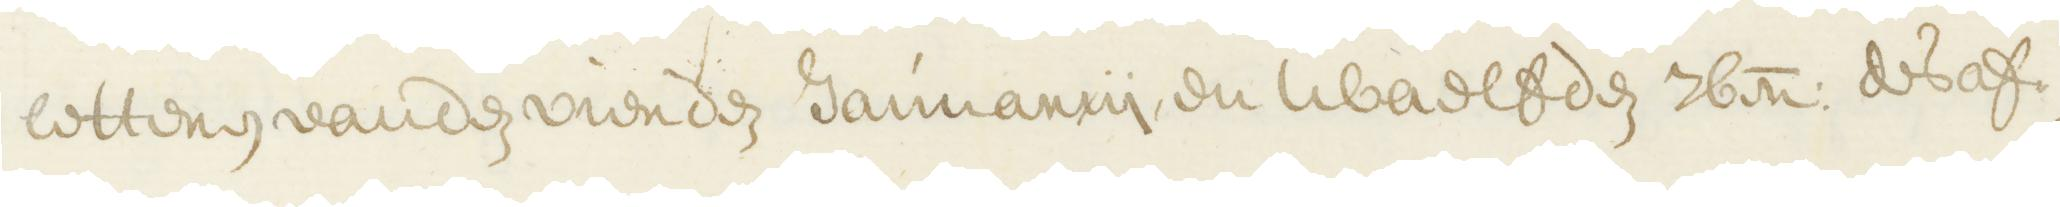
letteren vanden vierden Ianuarrij, en twaelfden 7ber: des af„
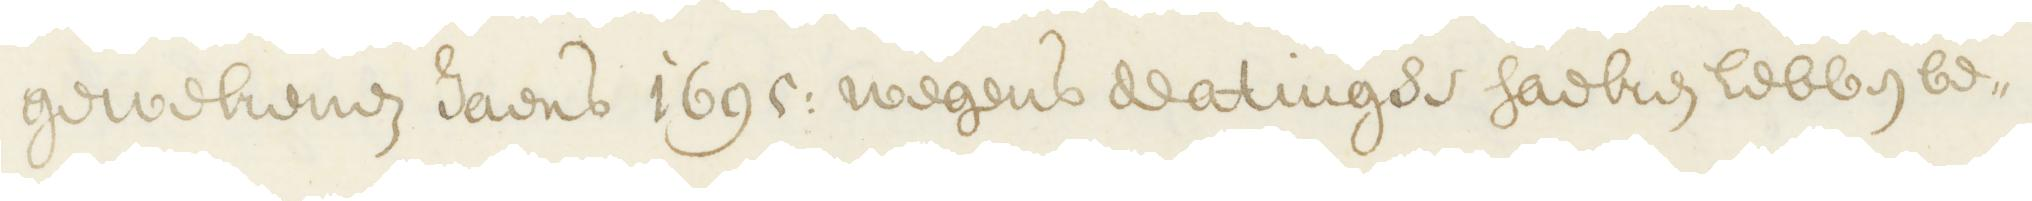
gewekenen Iaers 1695: wegens de atingse saeken hebben be„
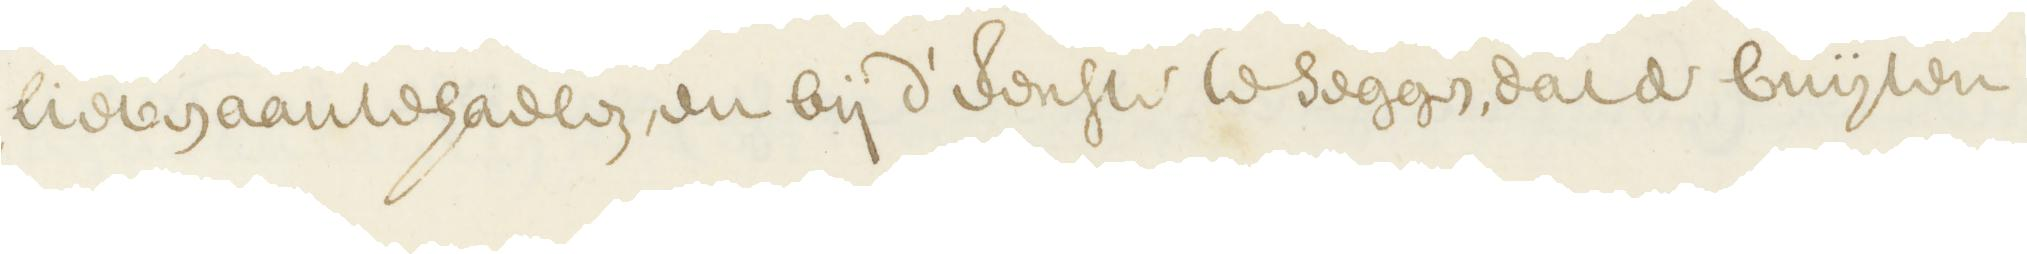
lieven aantehaelen, en bij d’ Eerste te seggen, dat de buijten
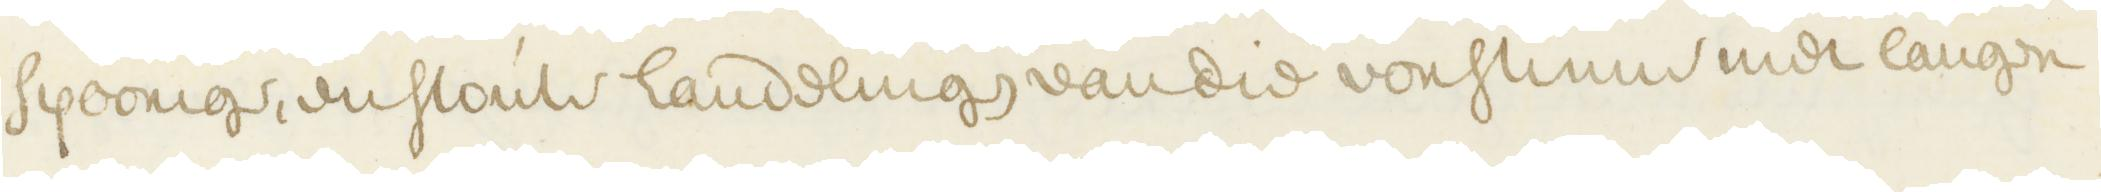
spoorige, en stoute handelingen van die vorstinne niet langer
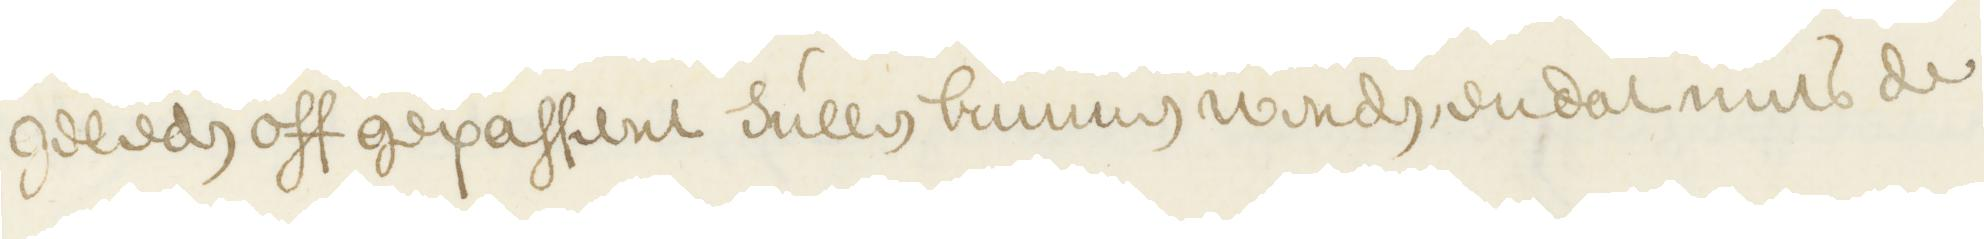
geleden off gepasseert sullen kunnen werden, en dat mits de
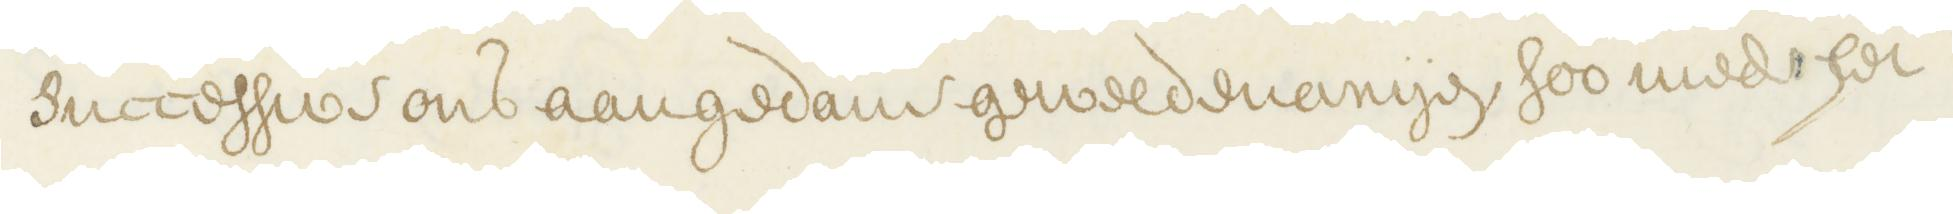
successive ons aangedane geweldenarijen, soo mede het
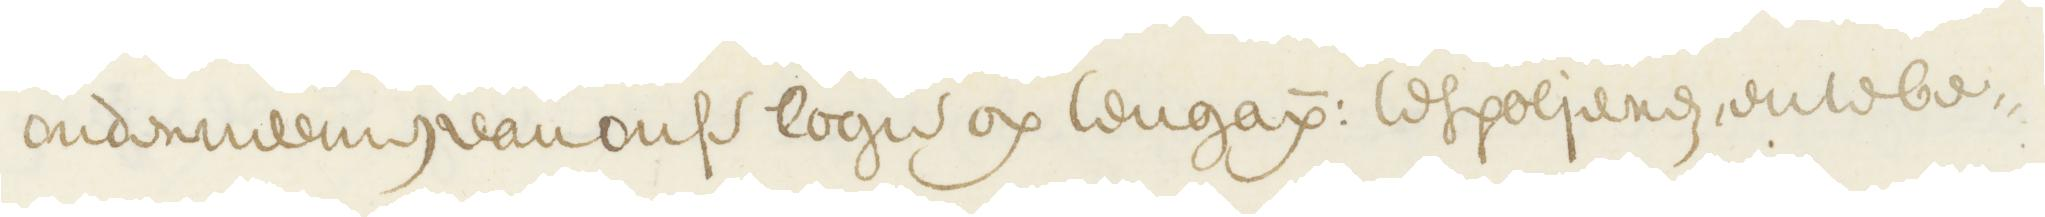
onderneemen van onse logie op tengap: tespoljeren, en te be„
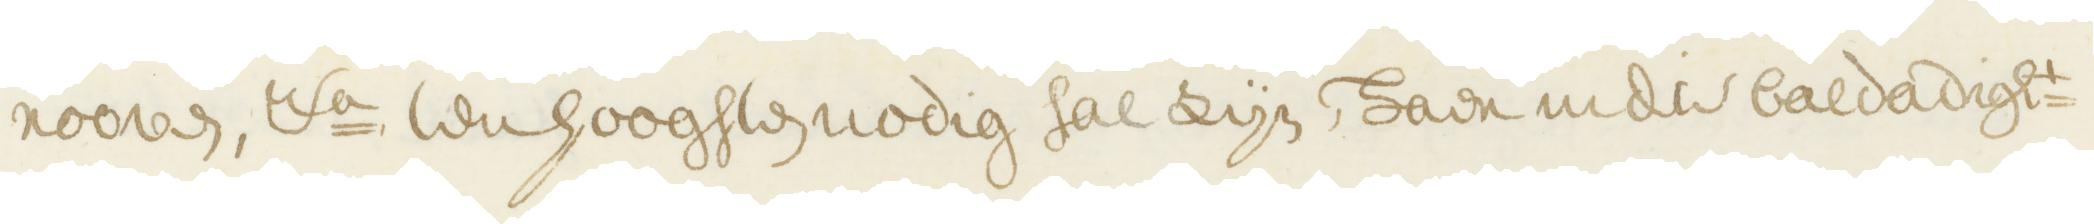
rooven, &=a, ten hoogsten nodig sal zijn, haer in die baldadigh=t
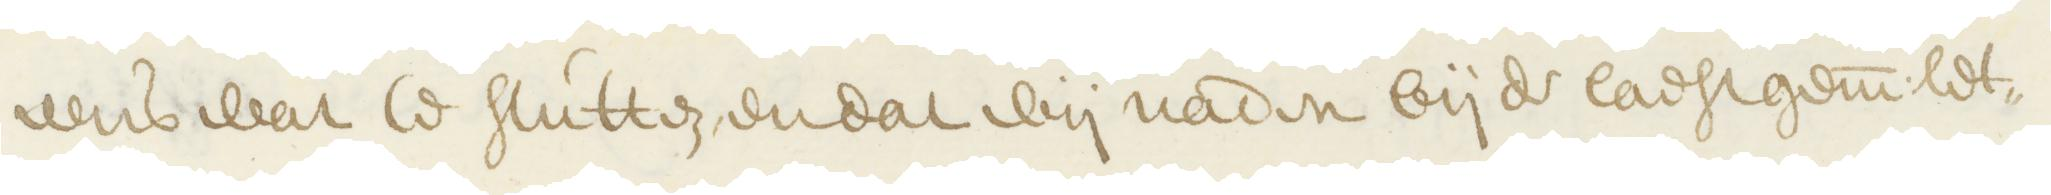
eens wat te stutten, en dat wij nader bij de laest gem: let„
